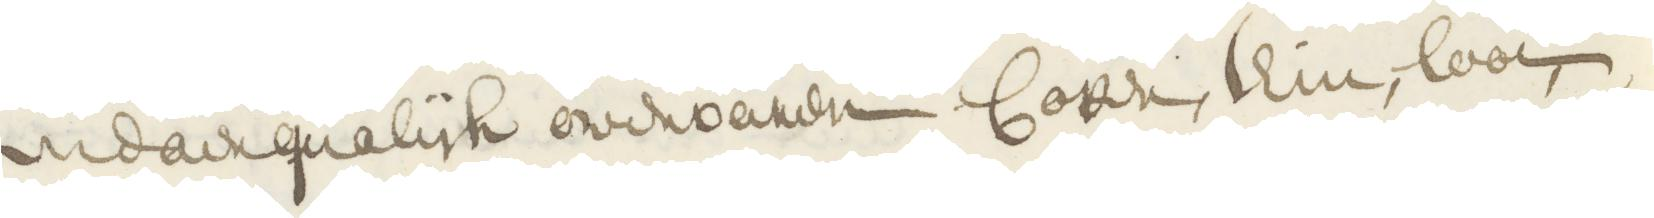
en daer qualijk overvaren Coper, thin, loot,
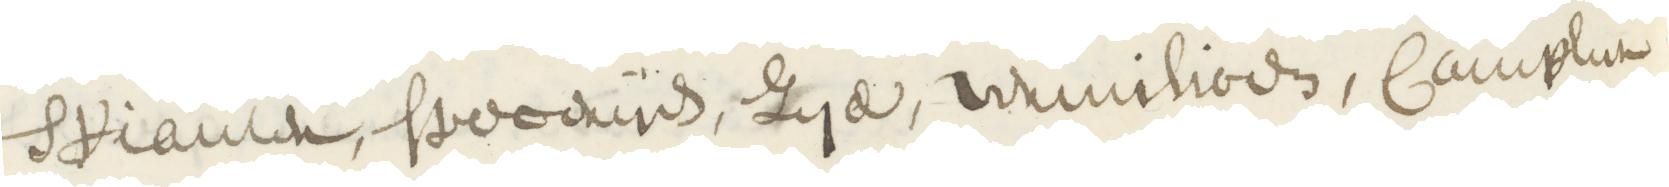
spiauter, specerijen, zijde, vermilioen, Camphur
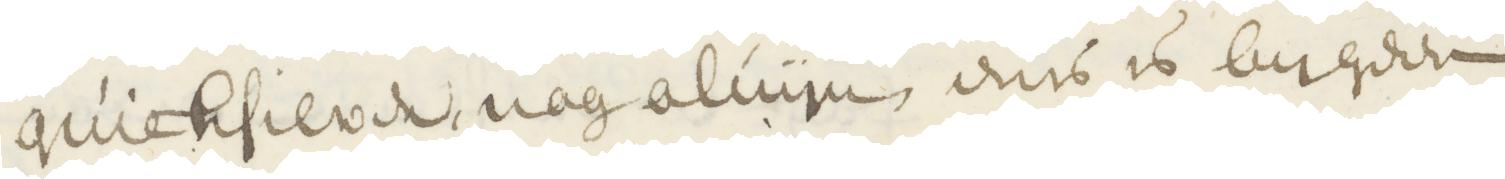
quicksilver, nog aluijn, enis is bijgeen
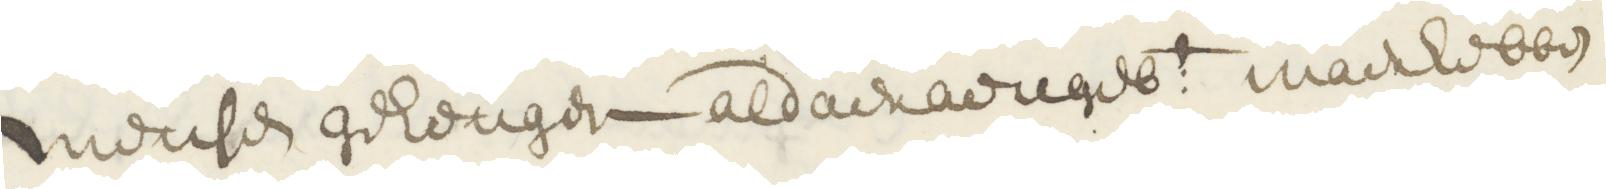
mensen geheugen aldaer aengeb:t maerhebben
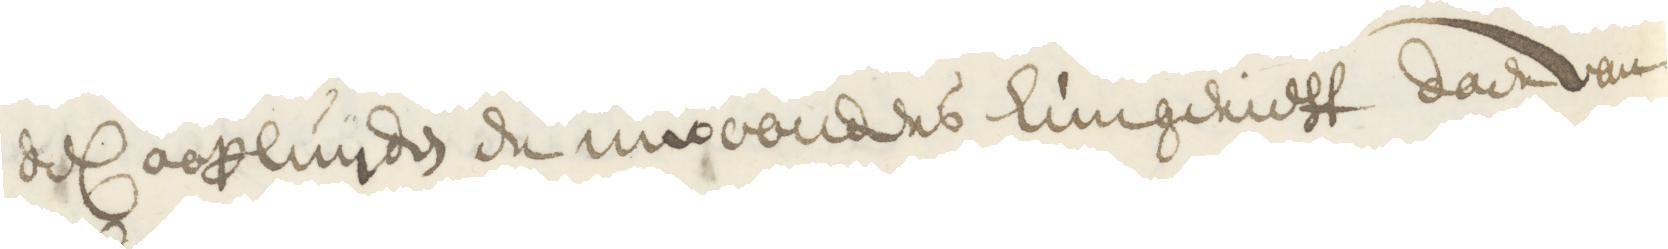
de Coopluijden en inwoonders hun gerieff daer van
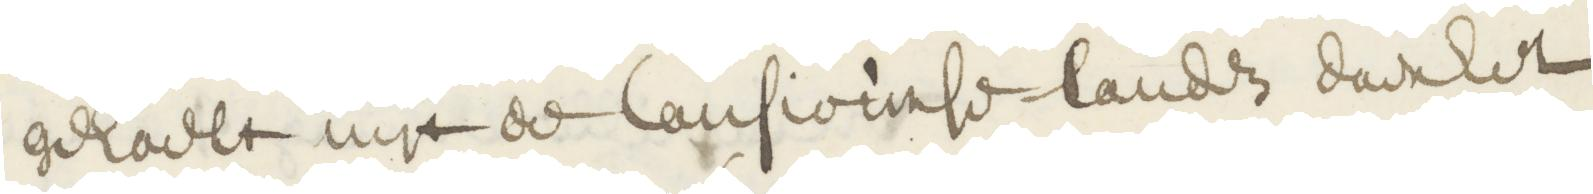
gehaelt uijt de tansiourse landen daer het
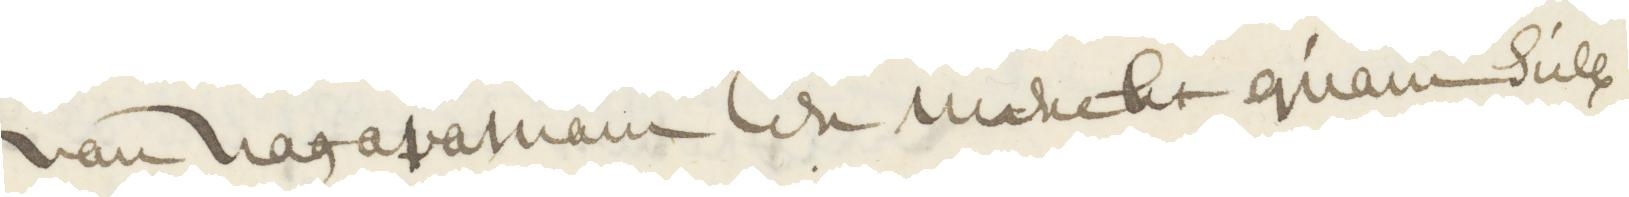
van nagapatnam ter merckt quam sulx
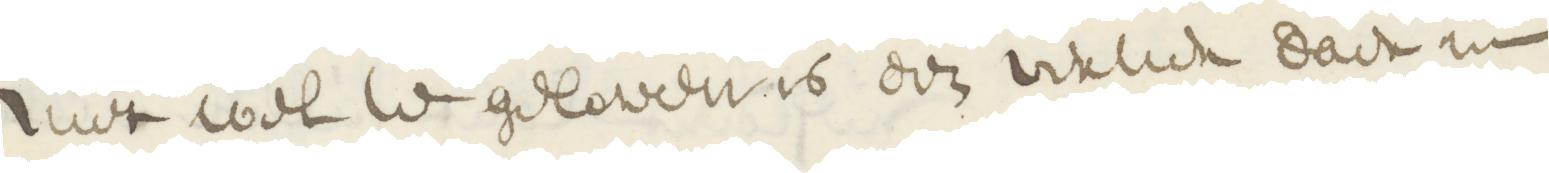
niet wel te geloven is den vertier daer in
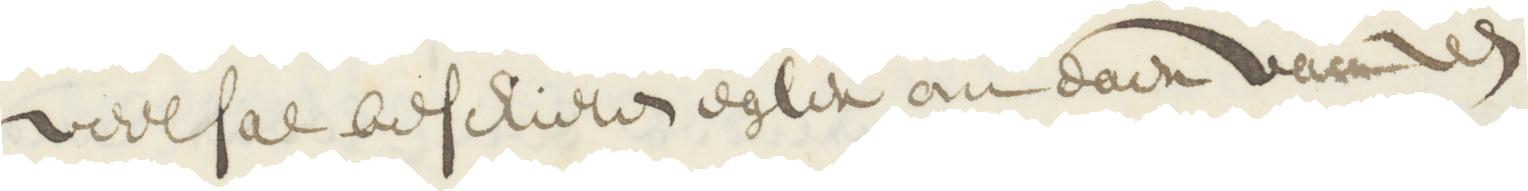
veel sal beschieten egler om daer van een
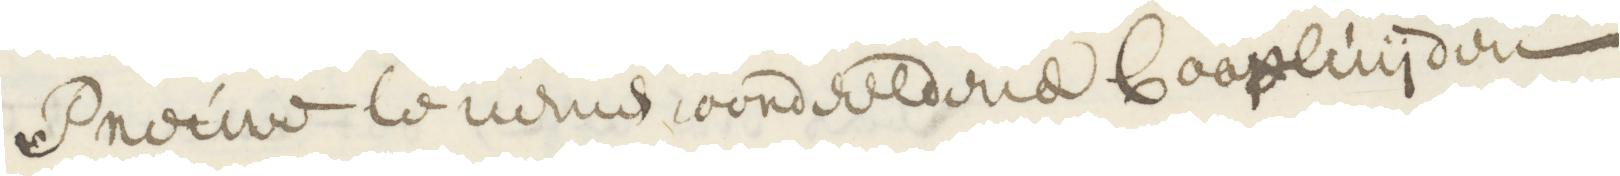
Preuve te nemen, oordeeldende Coopluijden
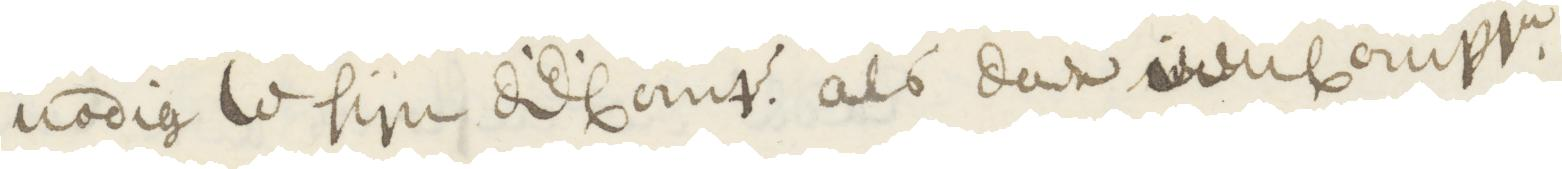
nodig te sijn d'E'Comp. als daer een Compt:r
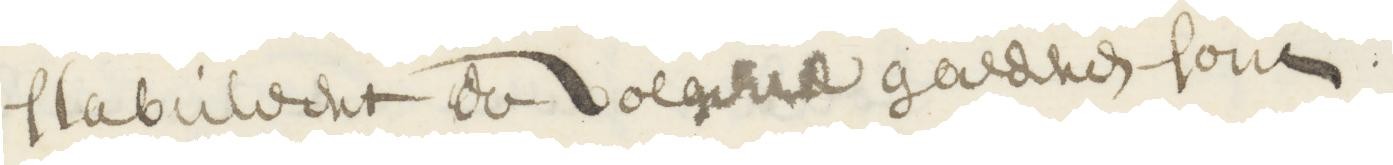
stabuleert de volgende goederen sont:
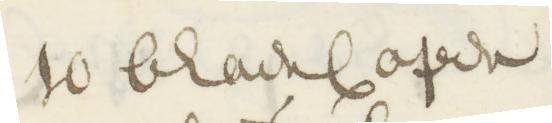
10 bhaer Coper
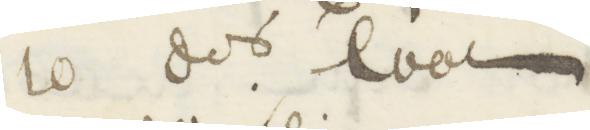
10 d.os loot
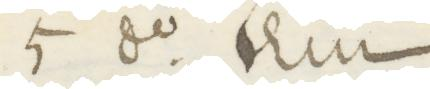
5 d.o thin
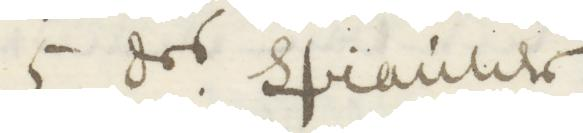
5 d.os spiauters
